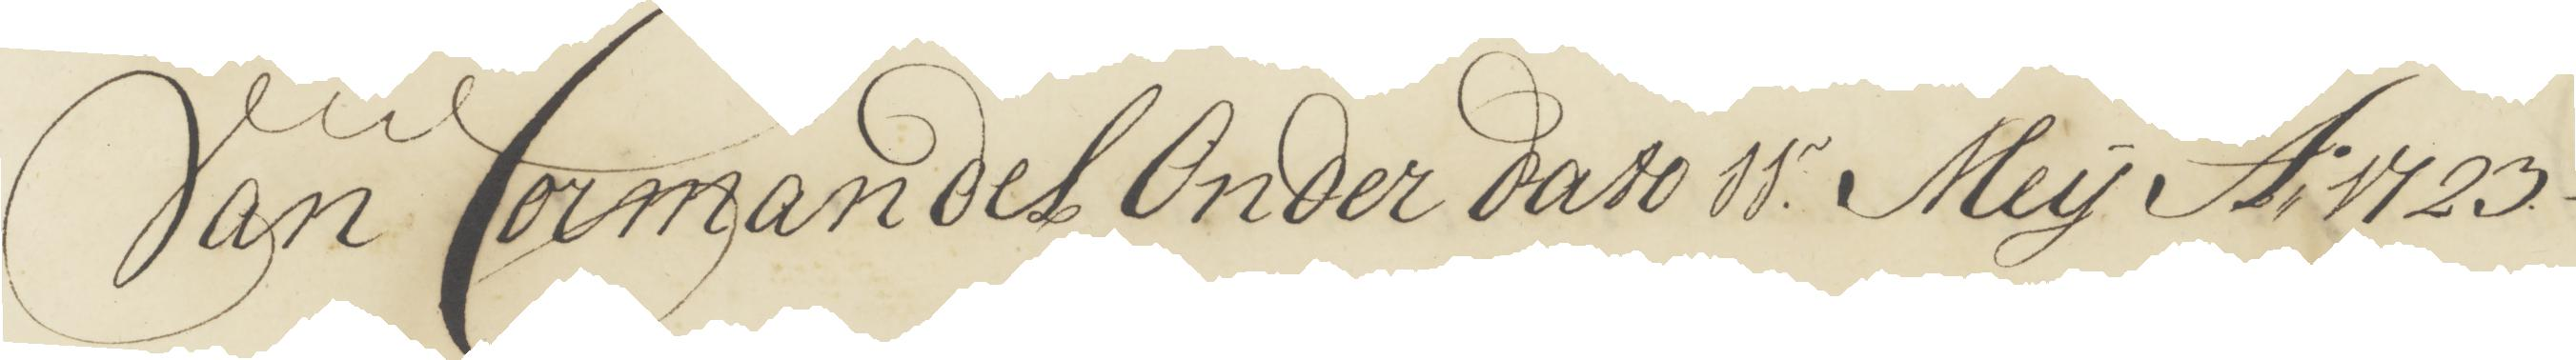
Van Cormandel Onder dato 11:' Meij A„o 1723.
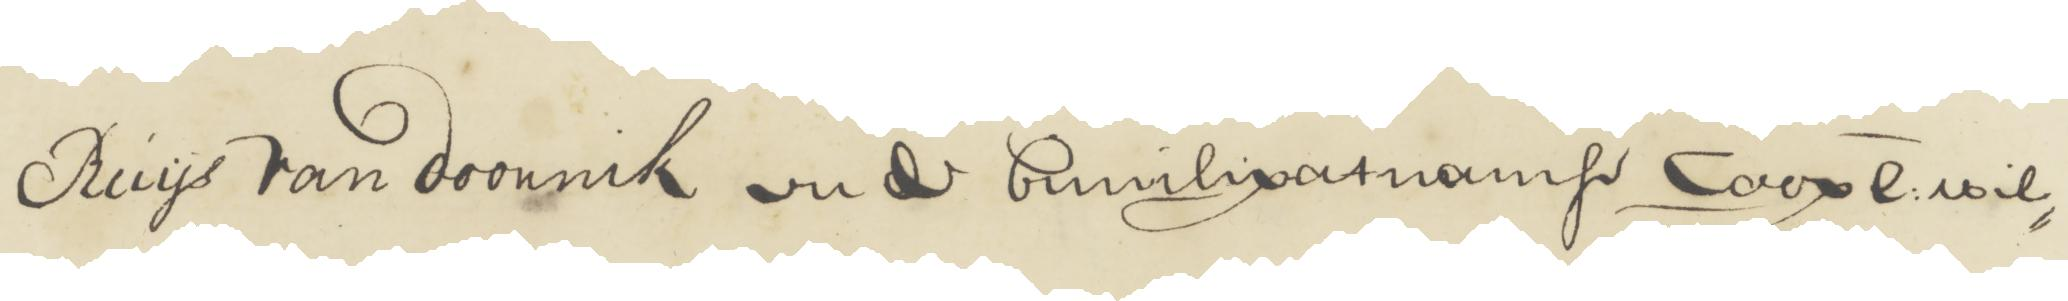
Ruijs van doornik en de bimilipatnamse Coopl: wil„
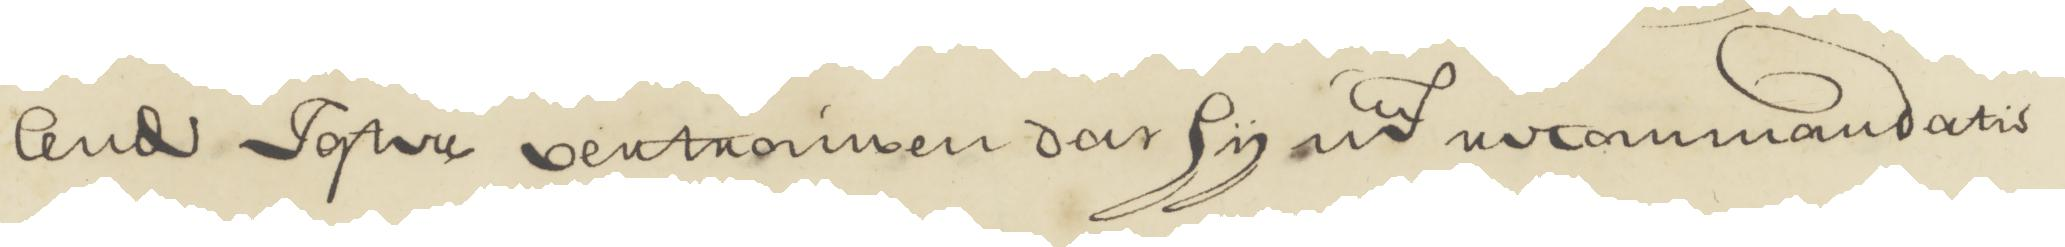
lende Egter vertrouwen dat hij uE recommandatie
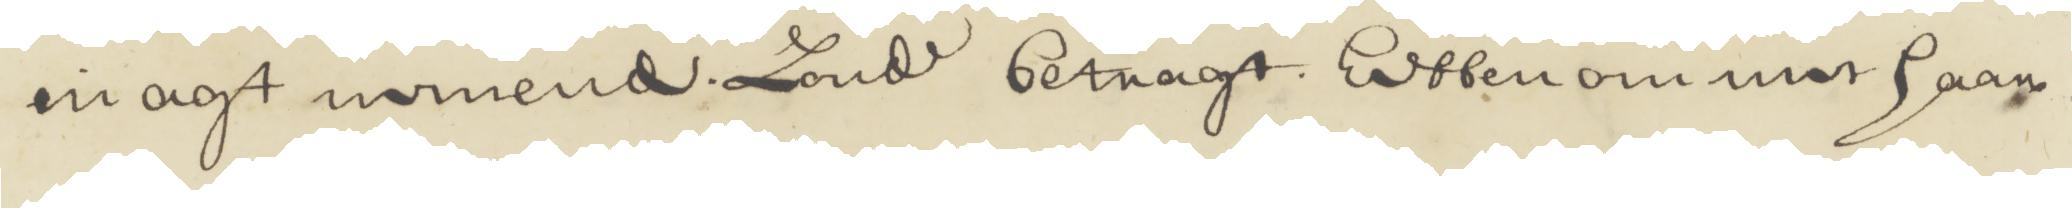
in agt nemende zoude betragt hebben om met haar
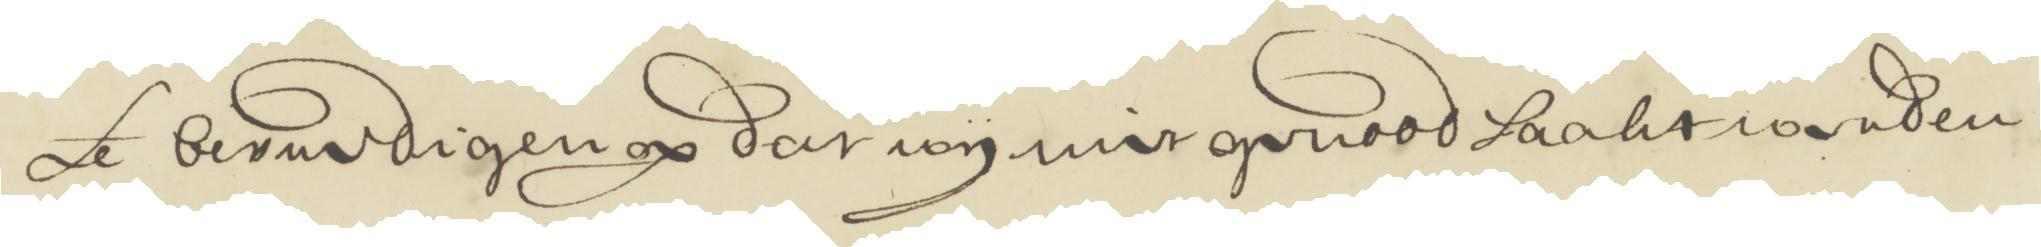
te bevredigen op dat wij niet genood saakt werden
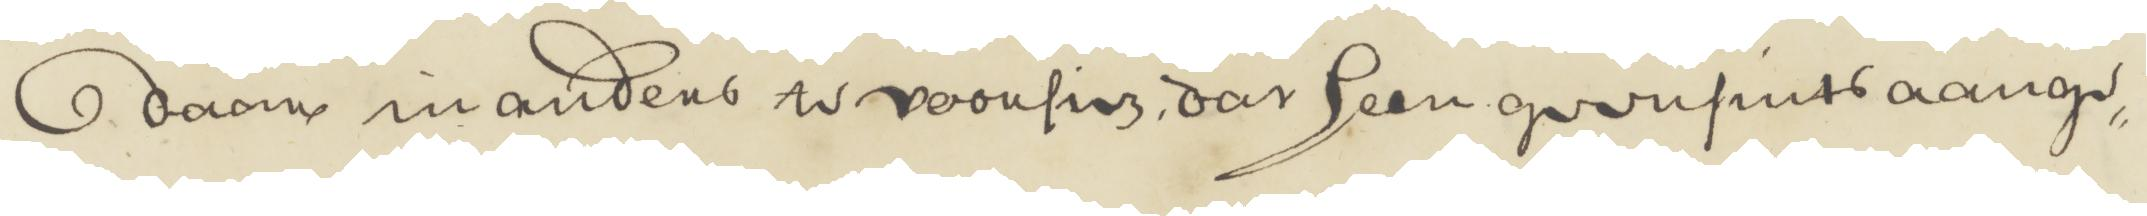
daar in anders te voorsien, dat heen geensints aange„
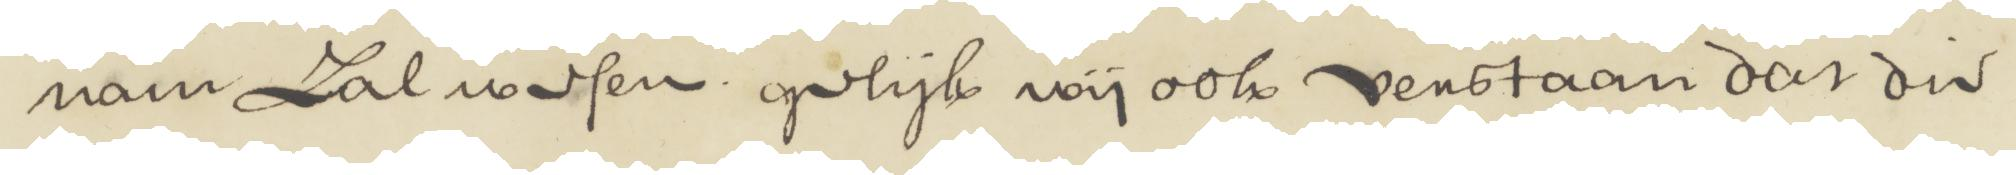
nam zal wesen gelijk wij ook verstaan dat die
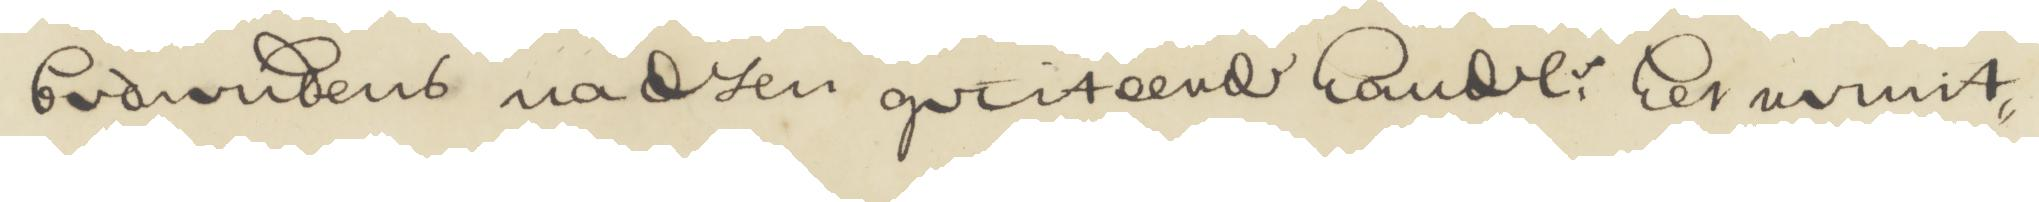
bediendens na desen geciteerde handel:s het remit„
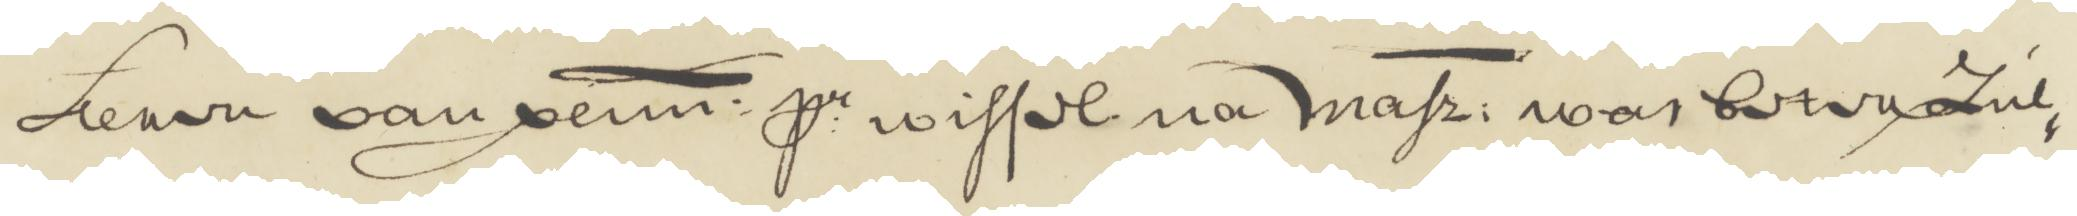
teren van penn: p:r wissel na Masz: wat beter zul„
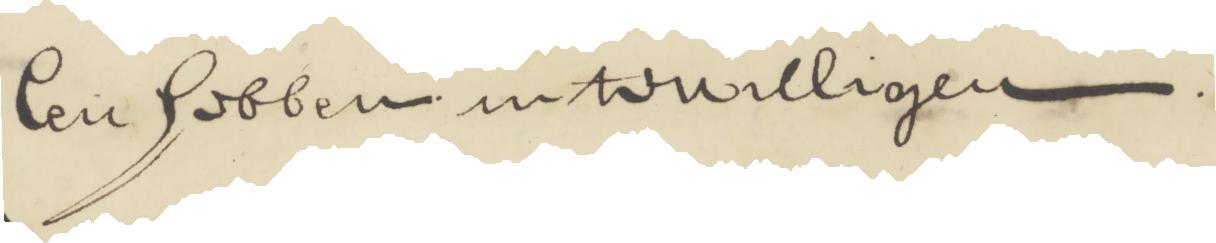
len hebben in tewilligen
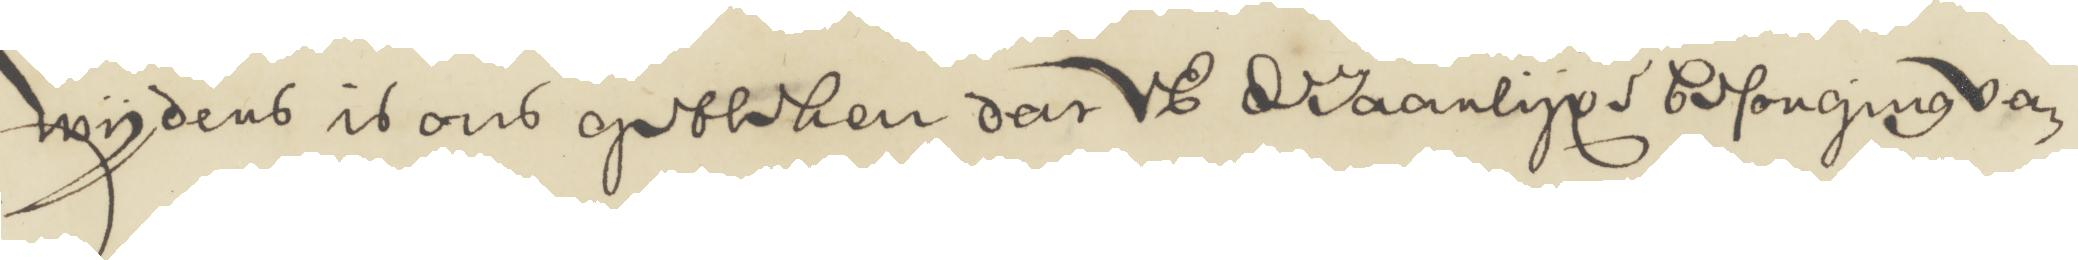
Wijders is ons gebleken dat VE de Iaarlijxe besorging Van
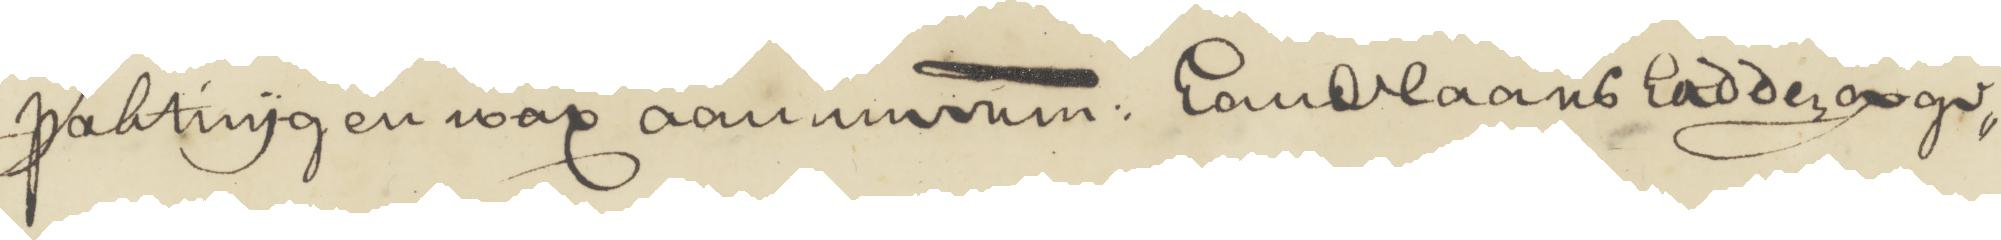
paktuijg en wax aan meerm: handelaars hadden opge„
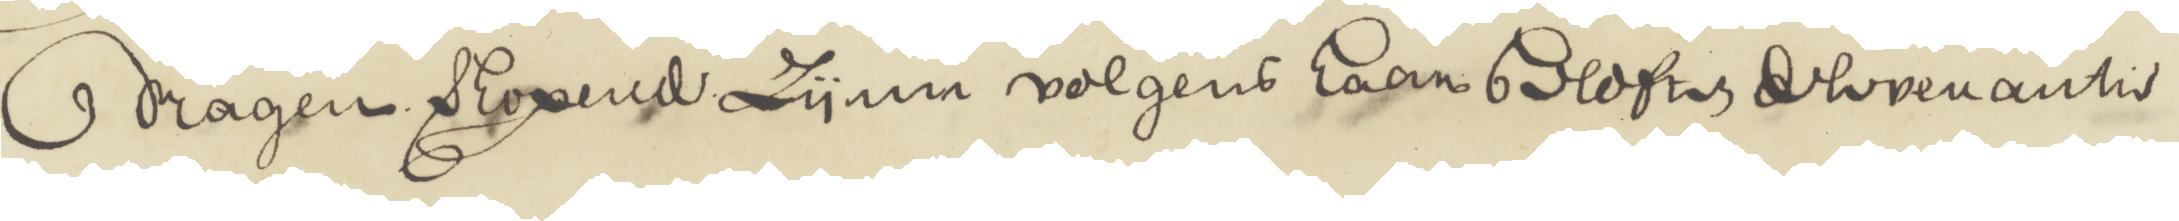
dragen verhopende zij nu volgens haar beloften de leverantie
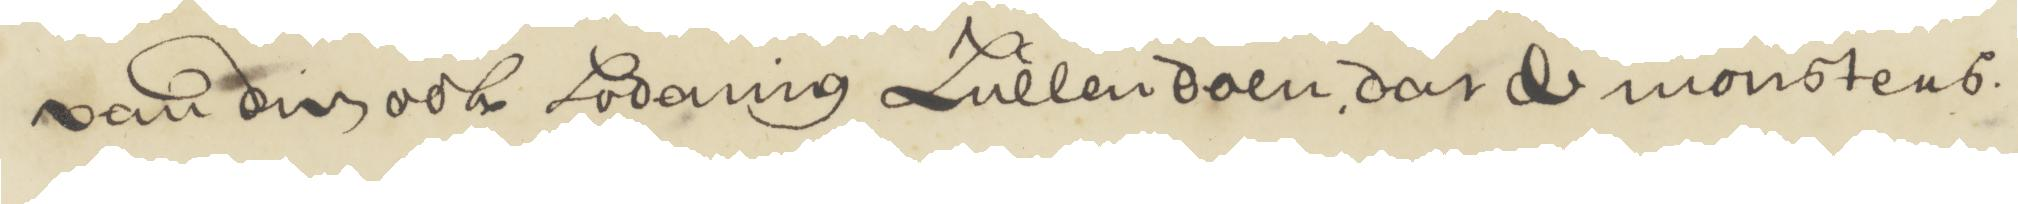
van dien ook sodanig zullen doen, dat de monsters
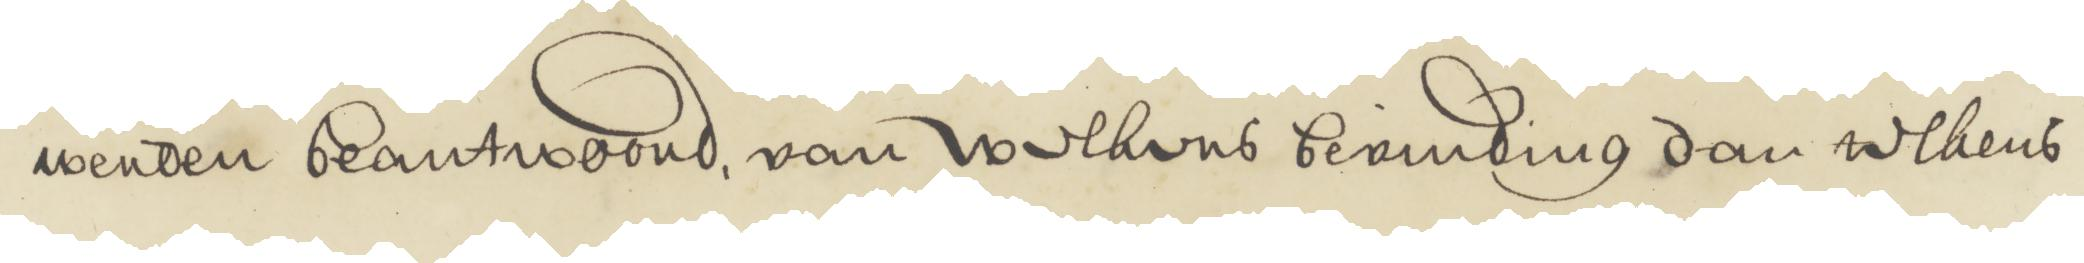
werden beantwoord, van welkers bevinding dan telkens
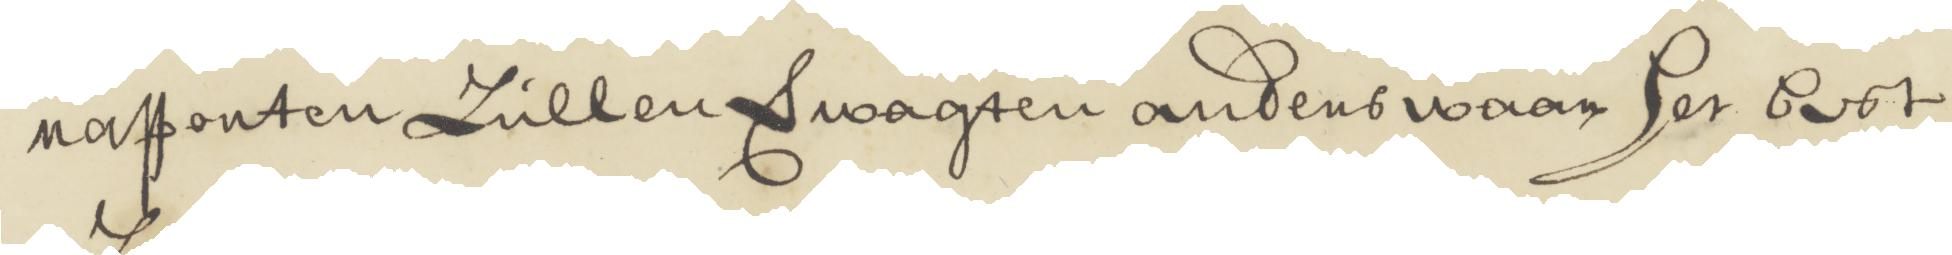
rapporten zullen verwagten anders waar het best
